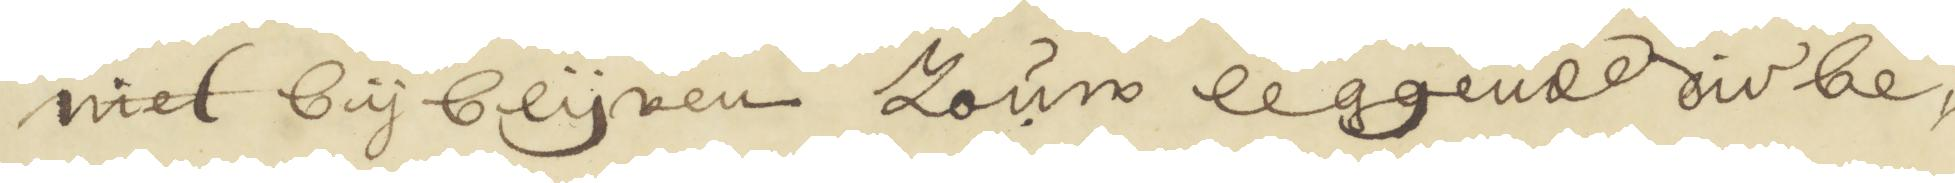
niet bij blijven zouw leggende die be
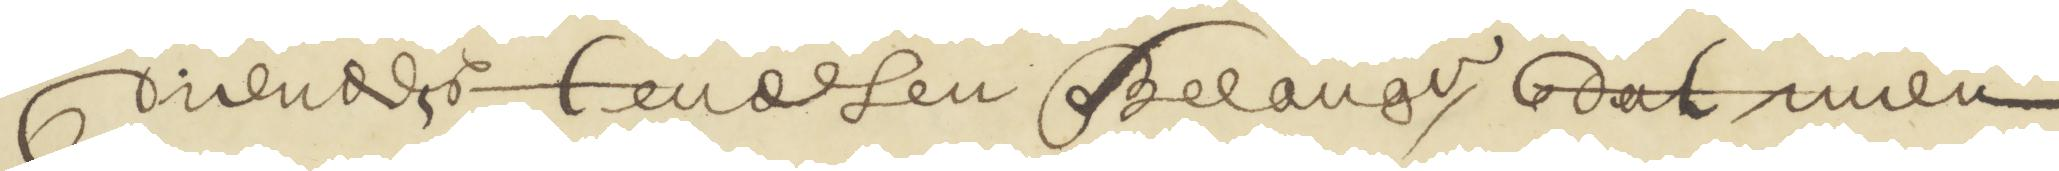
diendens ten desen Belange, dat men
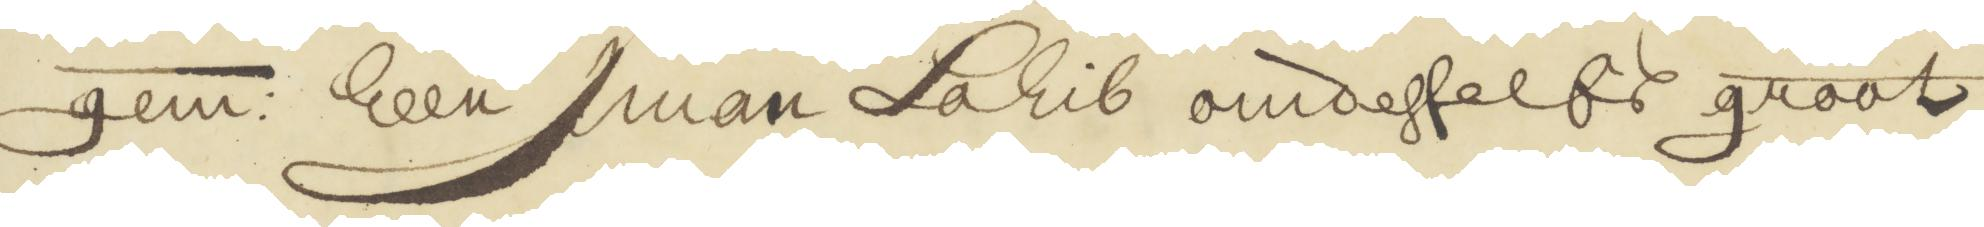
gem: heer Jman Lahib om desselfs groot
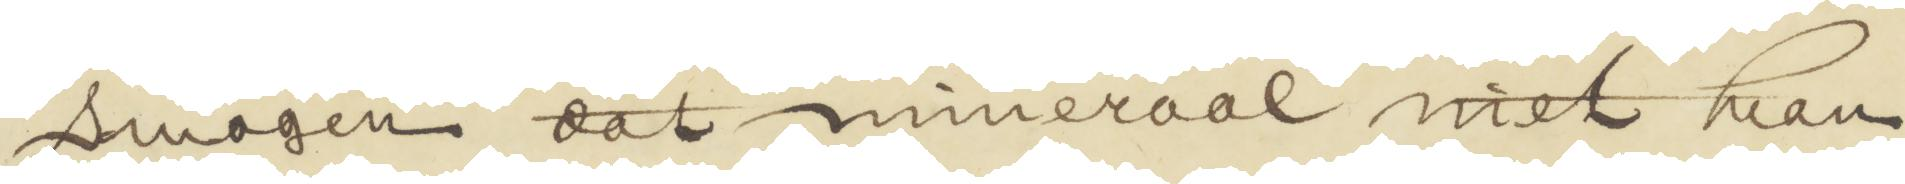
vermogen dat mineraal niet kan
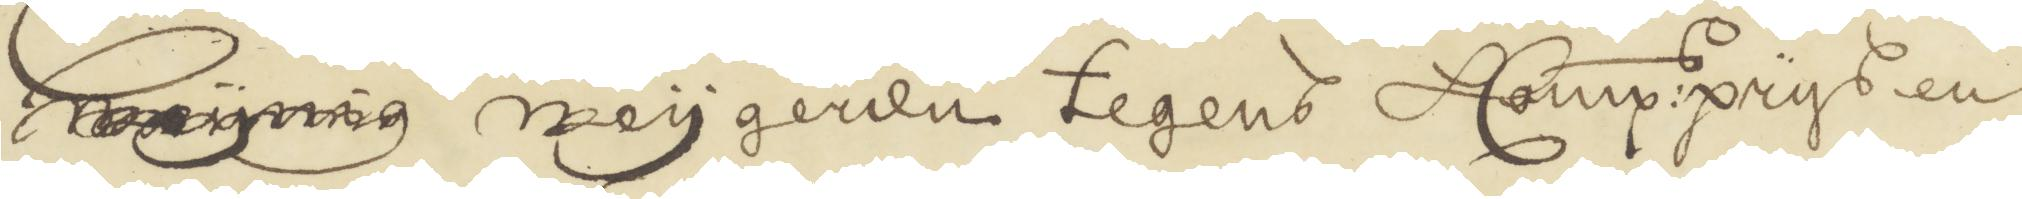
weijnig weijgeren tegens sComp:s prijs en
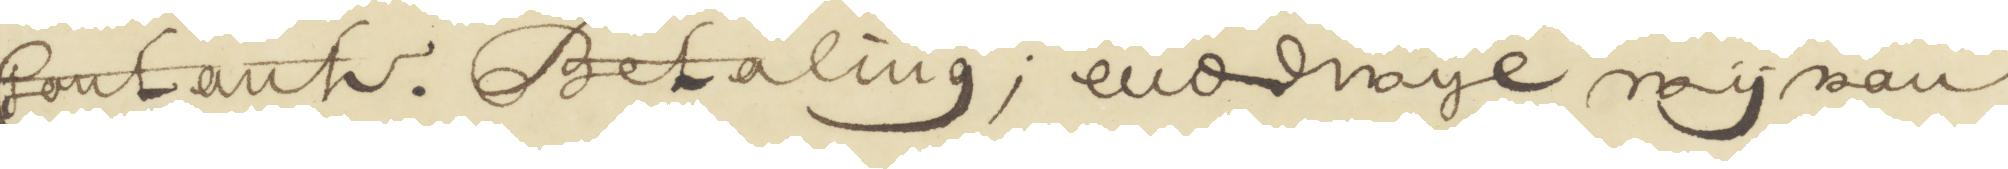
Contante. Betaling; endewijl wij van
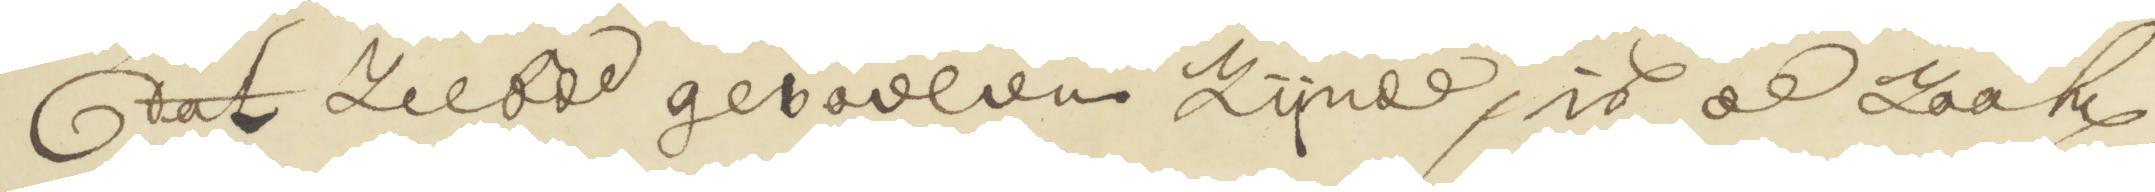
dat zelfde gevoelen zijnde, is de zaak
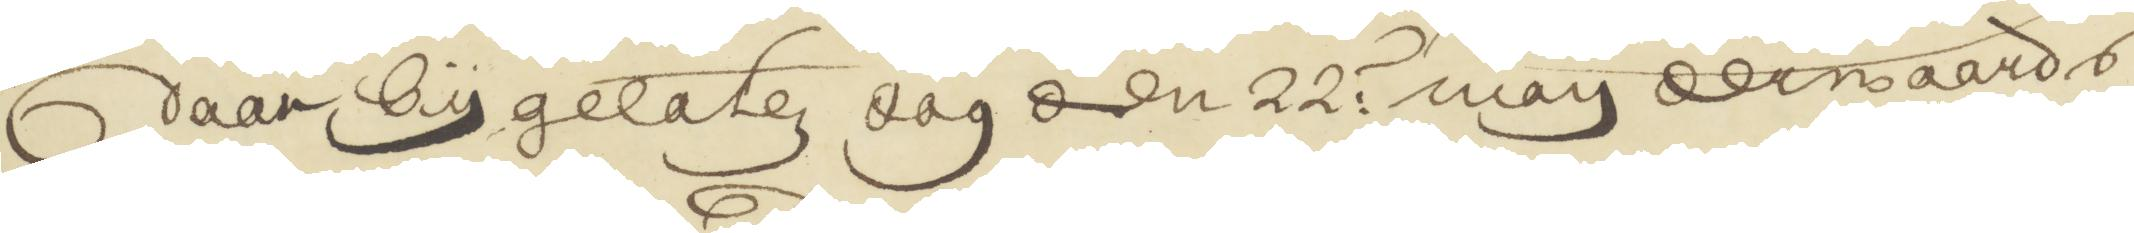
daar bij gelaten dog den 22:' maij derwaards
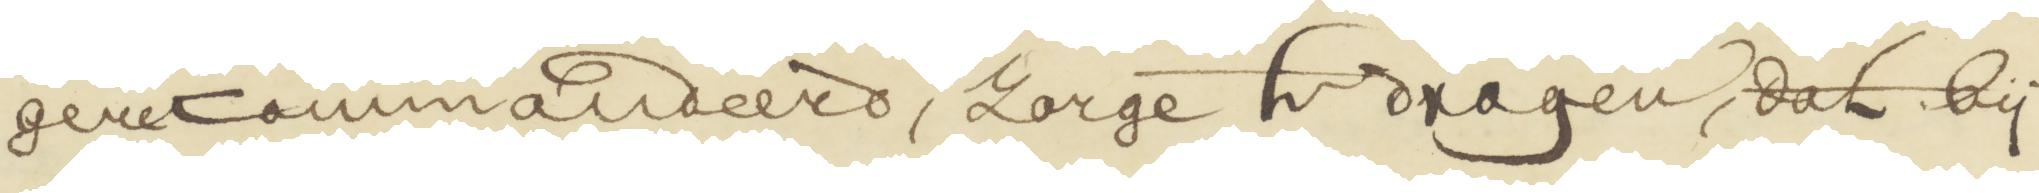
gerecommandeerd, zorge te dragen, dat bij
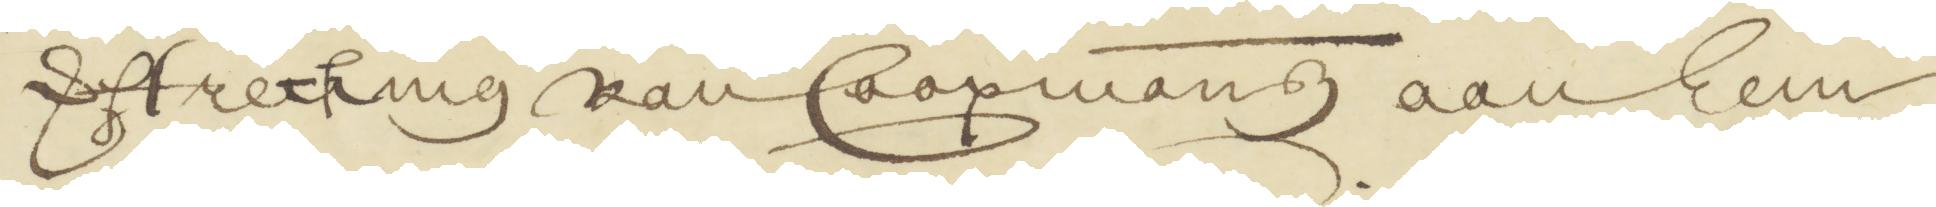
verstrecking van coopmanz aan hem
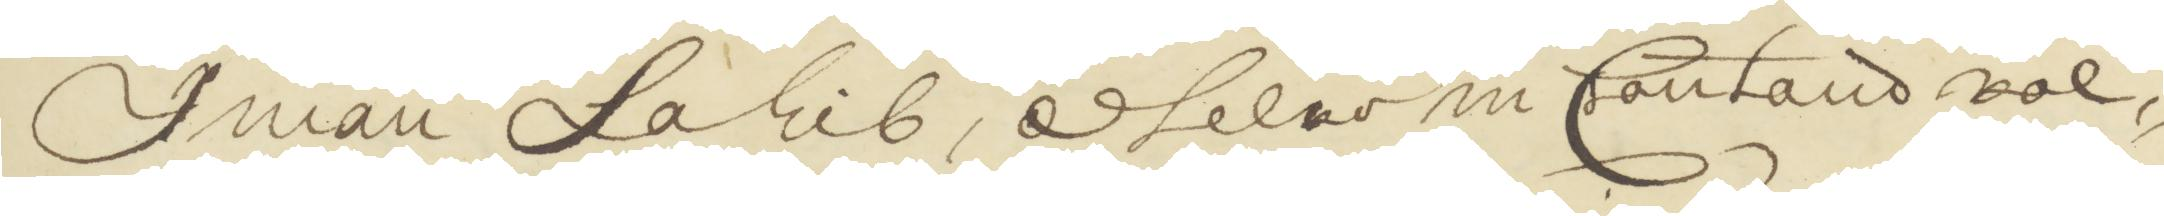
Iman Lahib, deselve in contand vol„
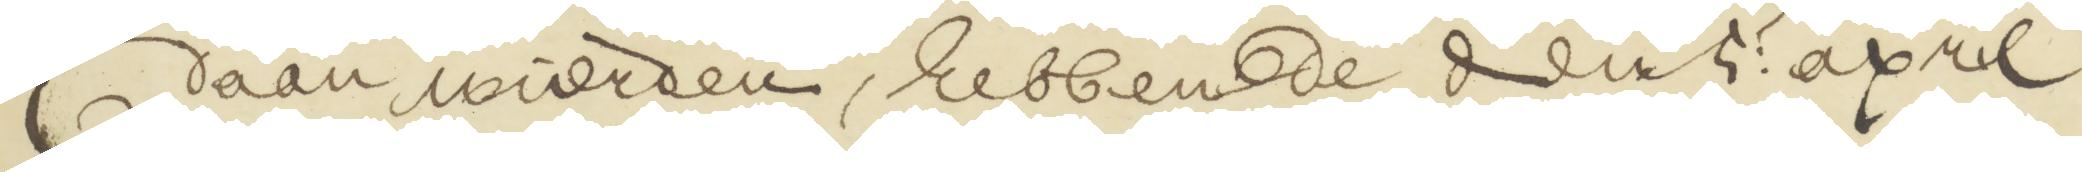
daan wierden, hebbende de in 5:' april
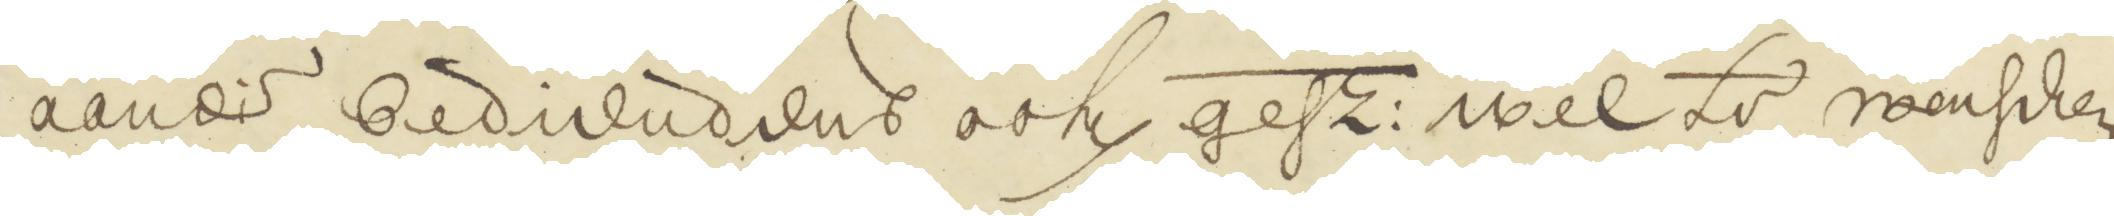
aan die bediendens ook gesz: wel te wenschen
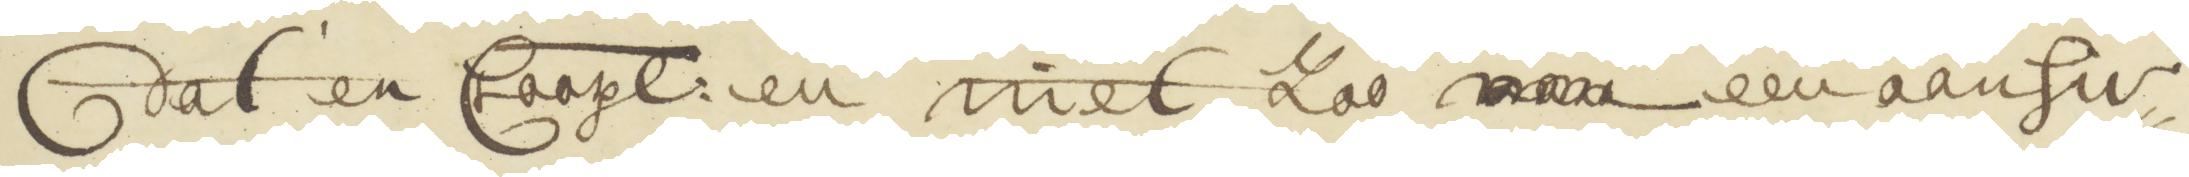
dat 'er Coopl: en niet zoo van een aansie„
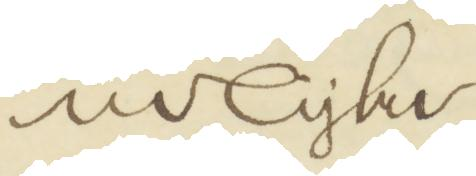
nelijke
